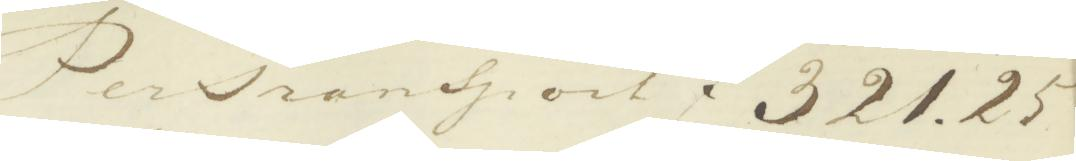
Per Transport ƒ 321.25.
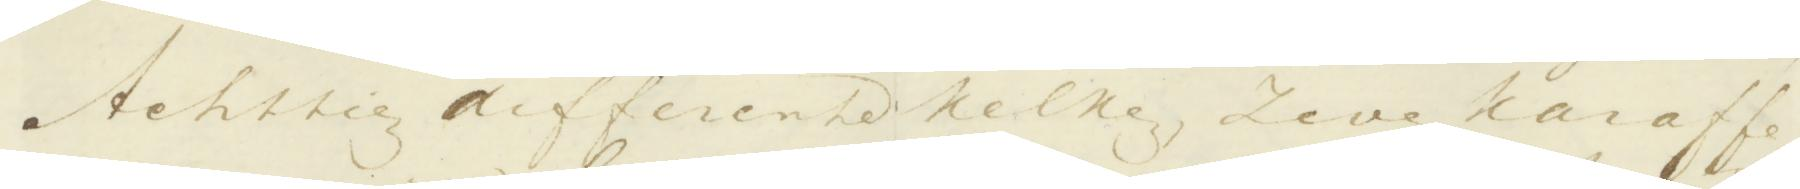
Achttien differente kelken zeven karaffe
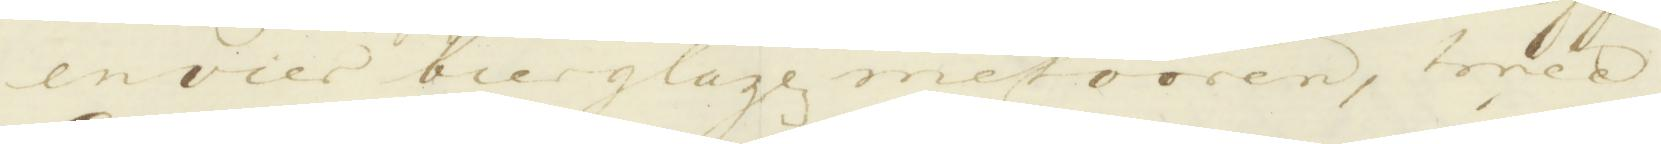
en vier bierglazen met ooren, twee
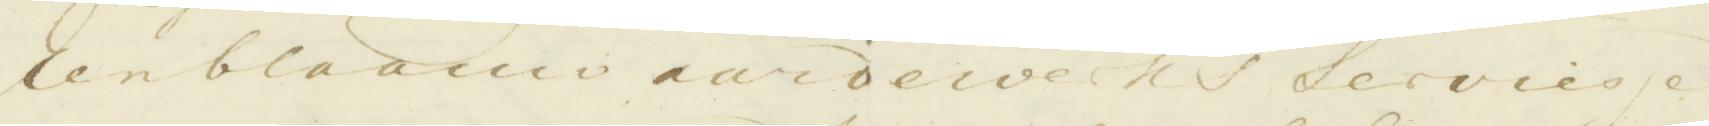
Een blaauw aardewerks serviesje
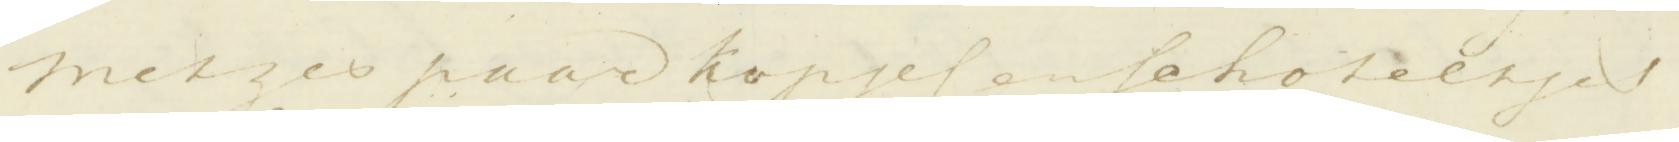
met zes paar kopjes en schoteltjes
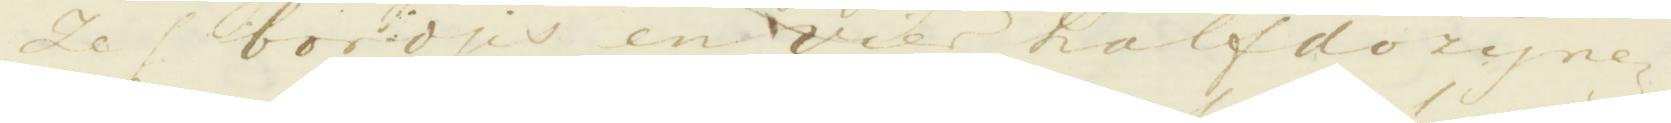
Zes bordjes en vier half dozynen
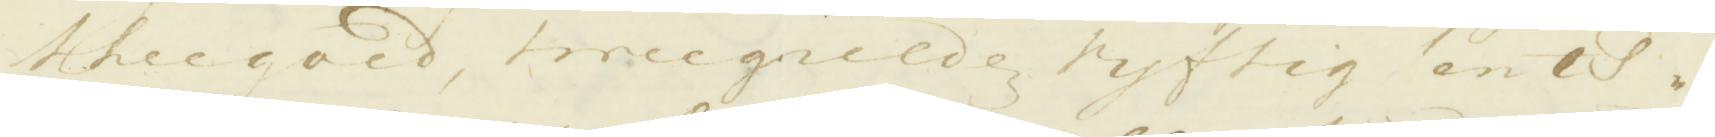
theegoed, twee gulden vyftig Cents„
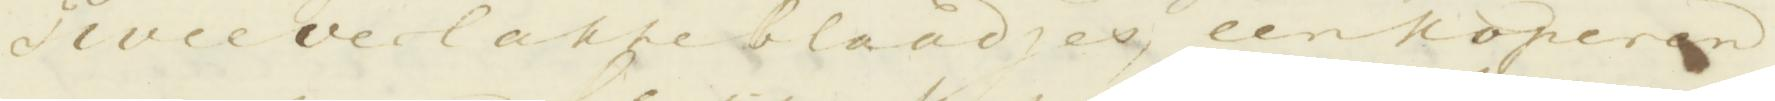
Twee verlakten blaadjes, een koperen
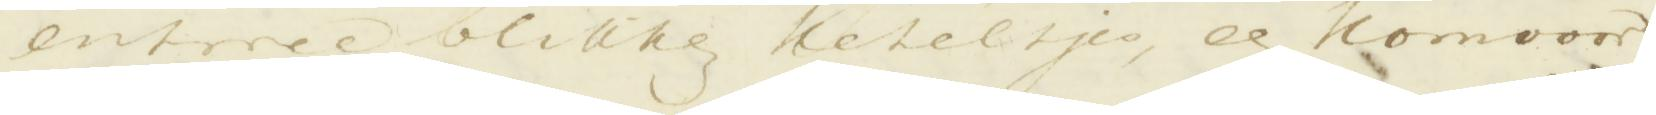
en twee blikken keteltjes, een komvoor
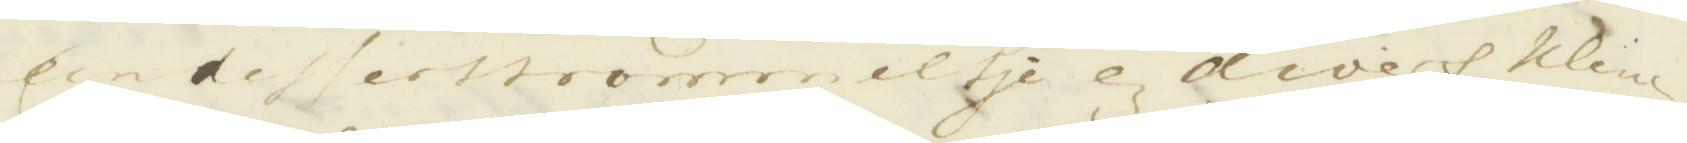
een desserttrommeltje en divers kleinen
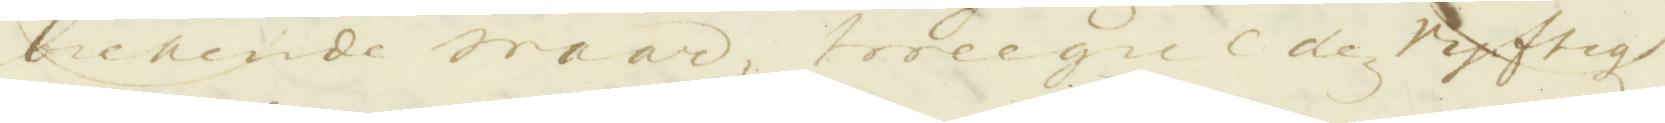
brekende waar, twee gulden Vyftig
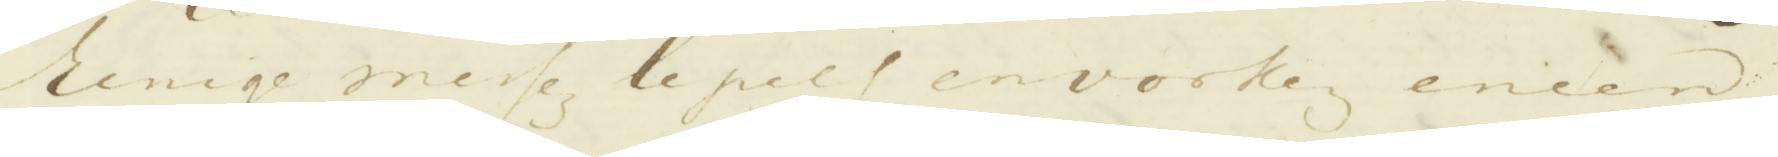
Eenige messen lepels en vorken en een
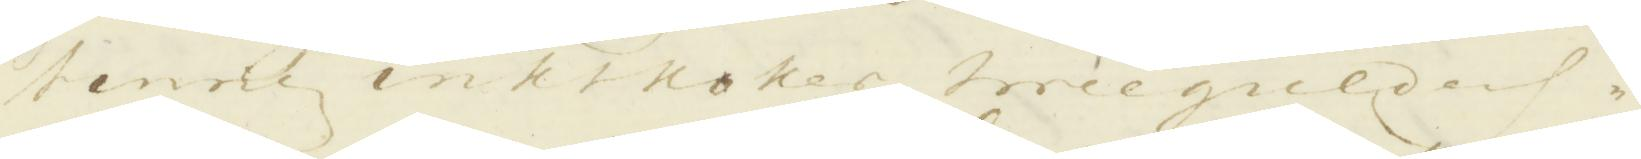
tinnen inktkoker, twee guldens „
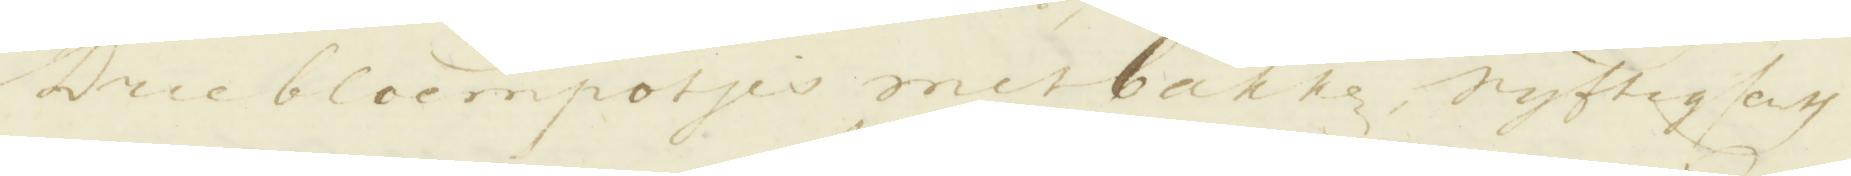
Drie bloempotjes met bakken, vyftig Cents
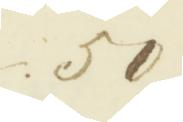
—:50
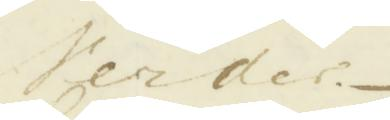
Verder.
